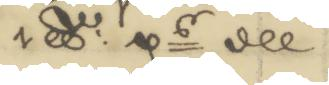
1 lb: p=r ell
